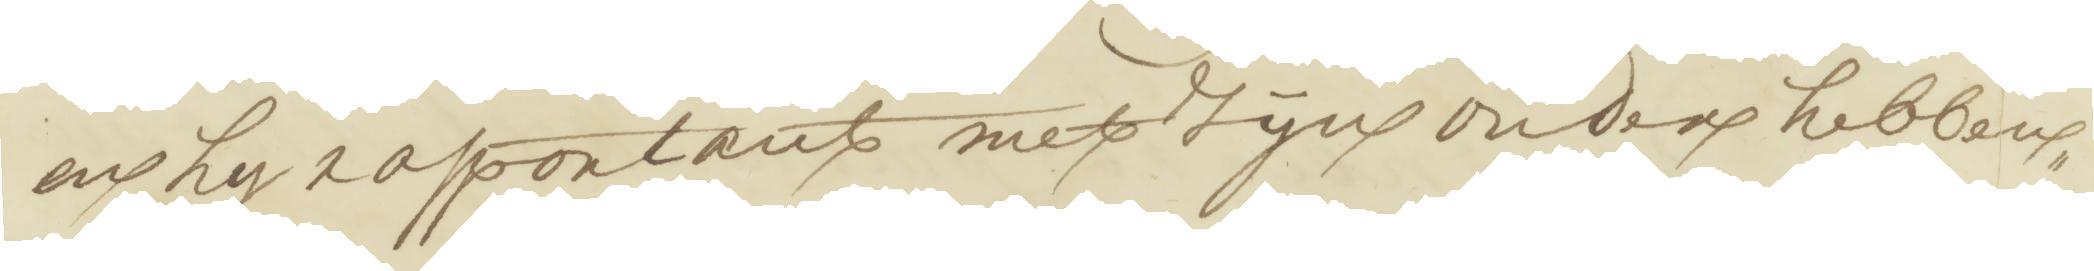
en hy rapportant met zijn onder hebben„
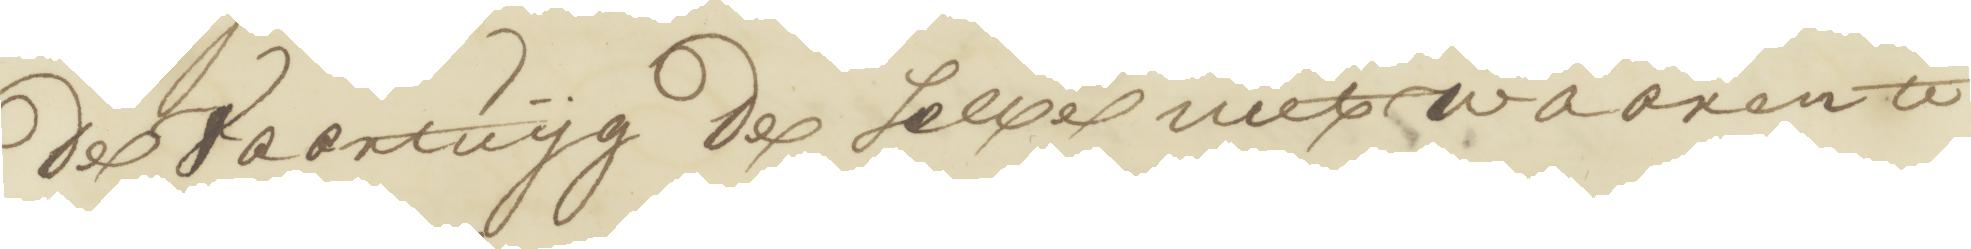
de vaartuijg de selve niet waaren te
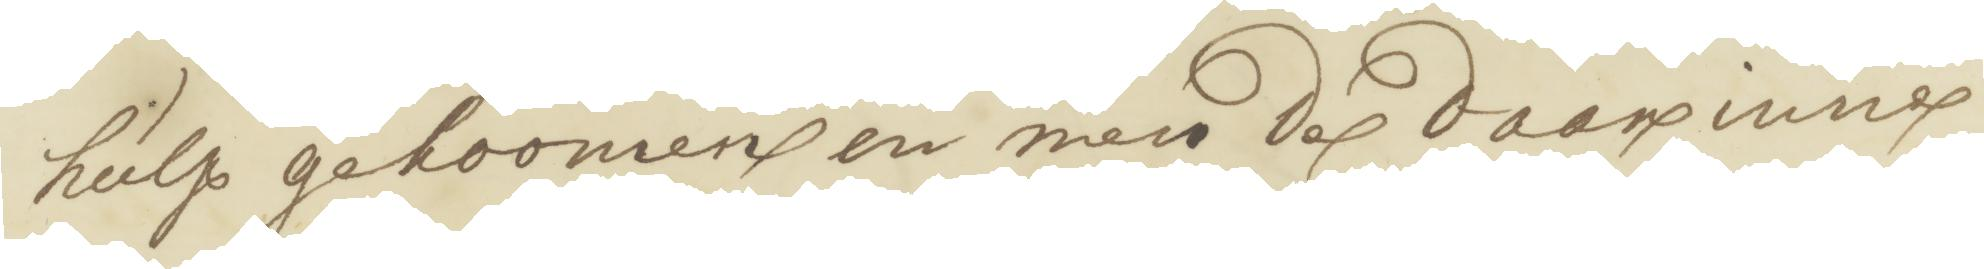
hulp gekoomen en men de daar inne
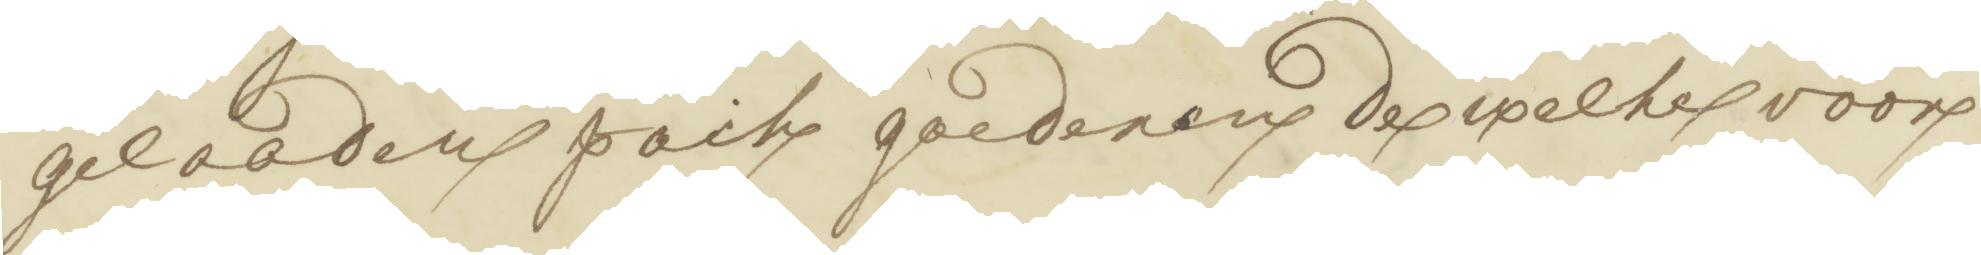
gelaaden pack goederen de welke voor
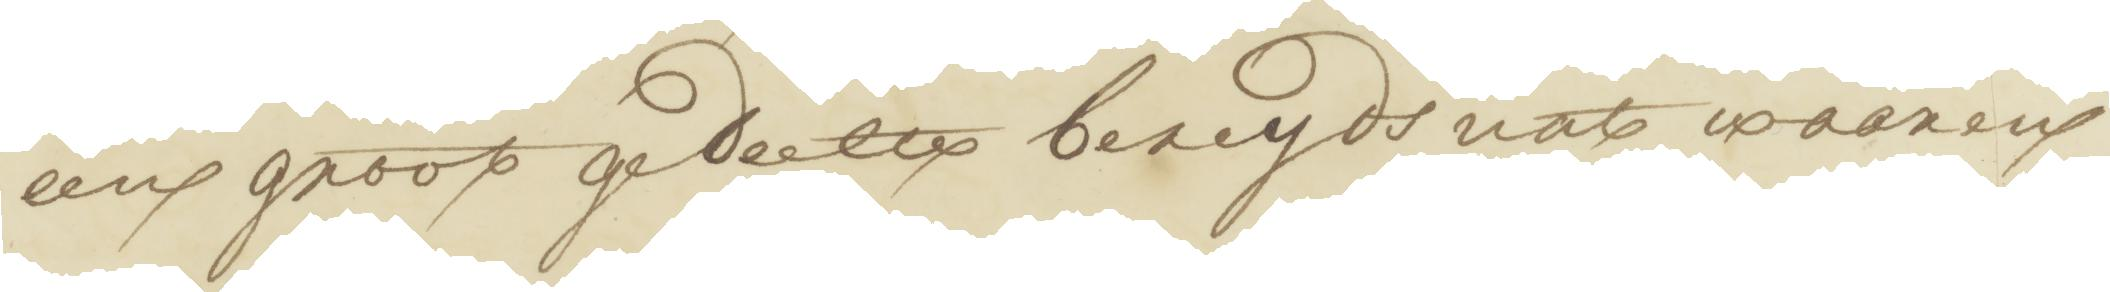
een groot gedeelte bereyds nat waaren
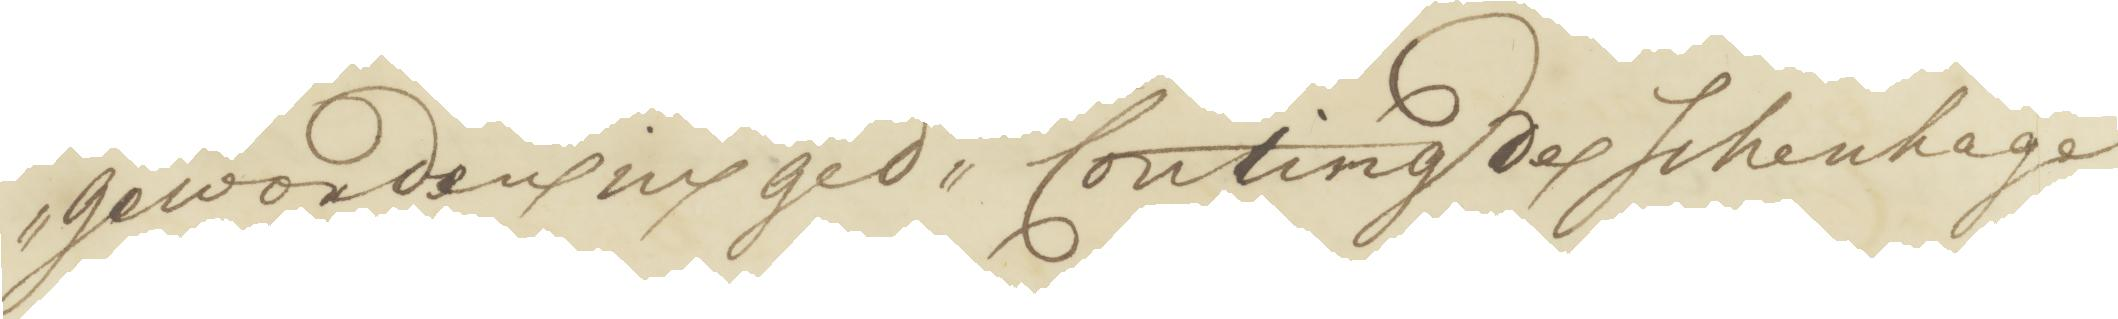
„geworden in ged„te Conting de schenkage
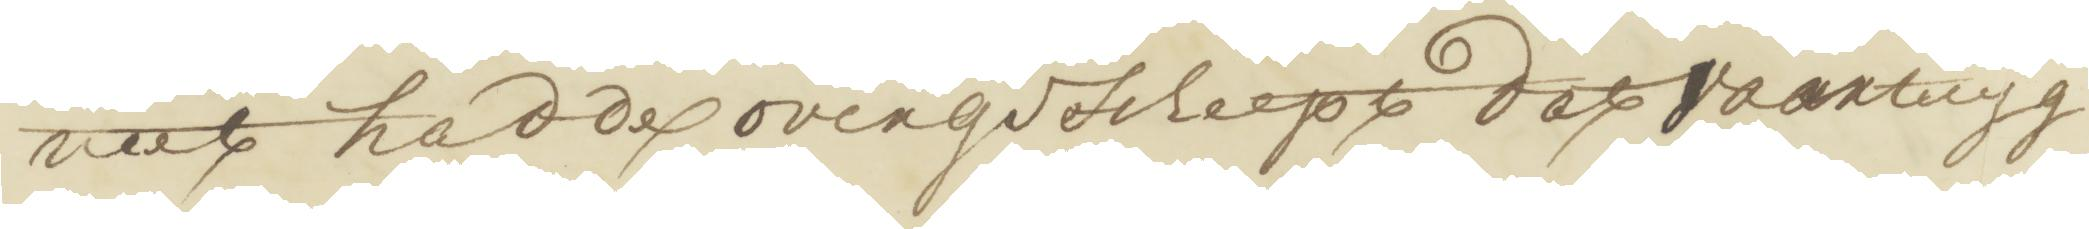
niet hadde overgescheept dat vaartuijg
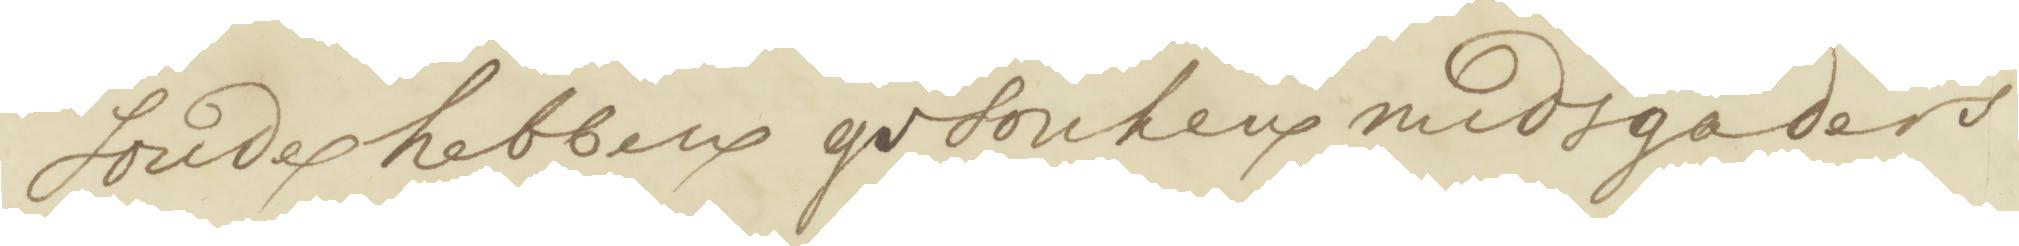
soude hebben gesonken midsgaders
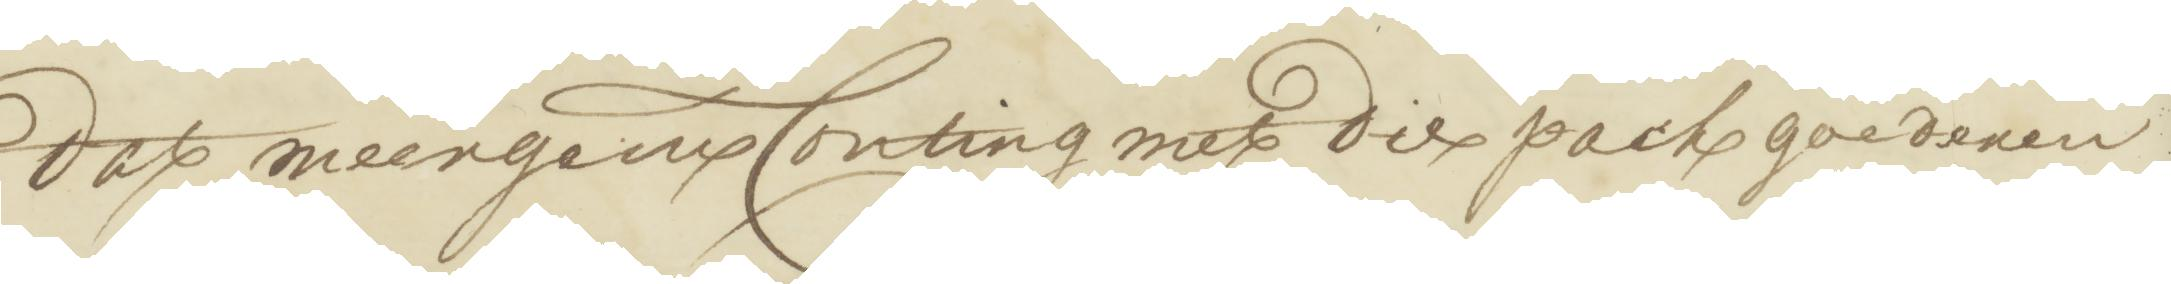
dat meergem Conting met die pack goederen
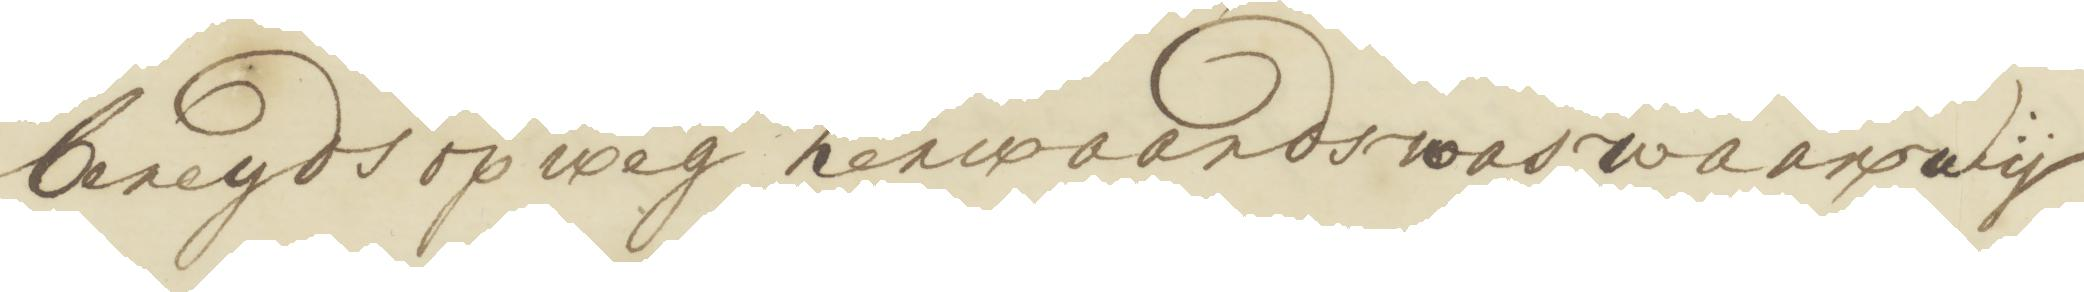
bereyds op weg herwaards was waar wij
